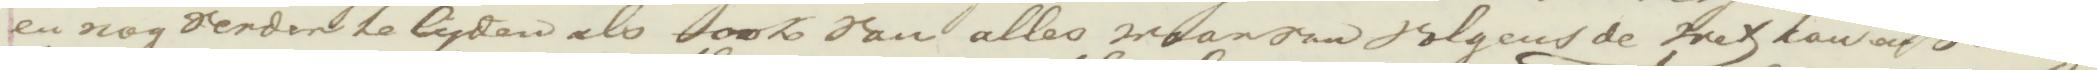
en nog verder te lijden als ook van alles waarvan volgens de wet kan en verwag
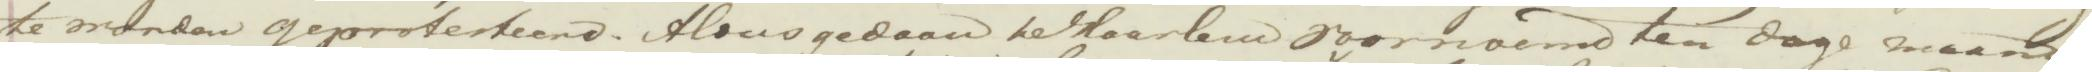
te worden geprotesteerd. Aldus gedaan te Haarlem voornoemd ten dage maand
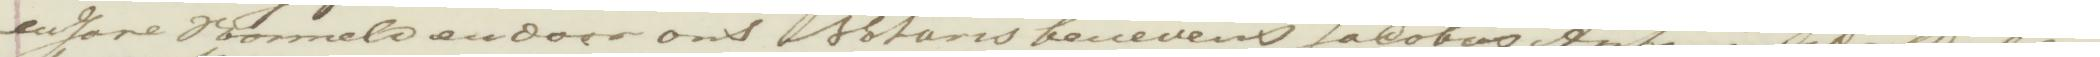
en jare Voormeld en door ons Notaris benevens Jacobus Antonius de Belle
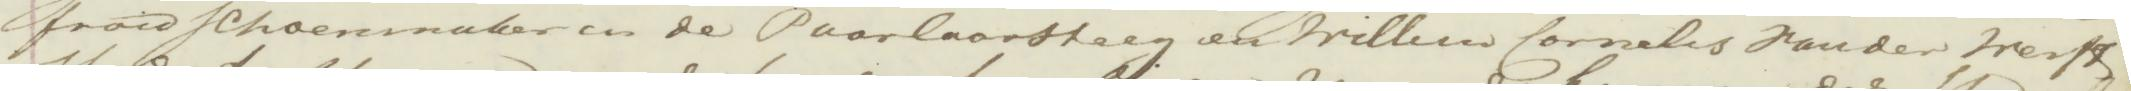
froid schoenmaker in de Paarlaarsteeg en Willem Cornelis Vander Werst
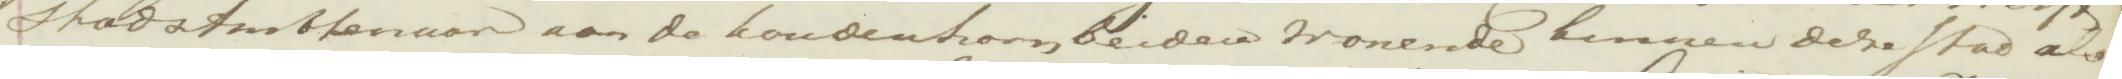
stad stucktenaar aan de kondenhorn beiden wonende binnen deze stad an
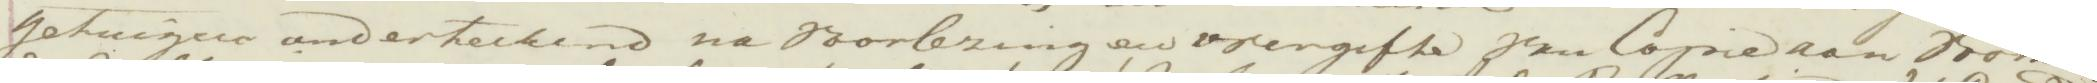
getuigen onderteekend na Voorlezing en overgifte van Copie aan Voornoem
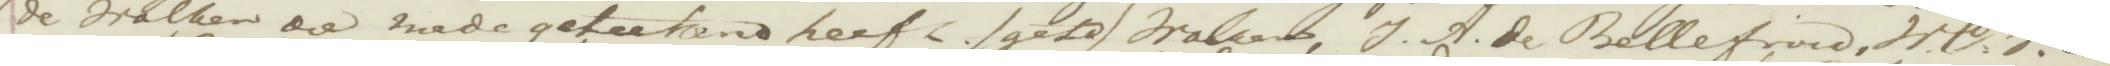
de walker de mede geteekend heeft. /getd/ Walken, J. A. de Bellefroid, W.C. V. d.
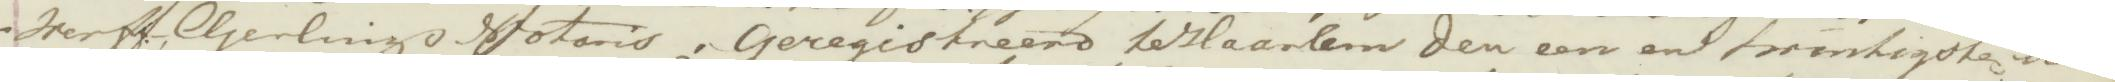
Werff C. Gerlings Notaris, Geregistreerd te Haarlem den een en twintigste Mei
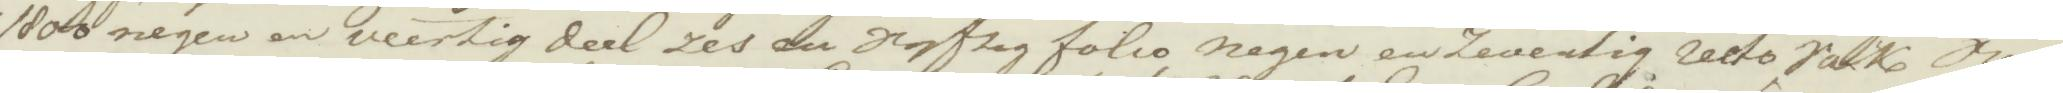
1800 negen en veertig deel zes en Vyftig folio negen en Zeventig recto Vak Vier
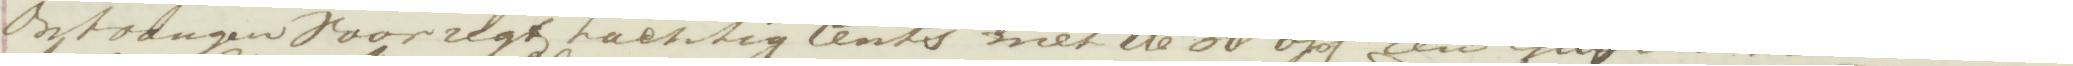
Ontvangen voor regt tachtig Cents met de 38 opC Een Gulden hien en een
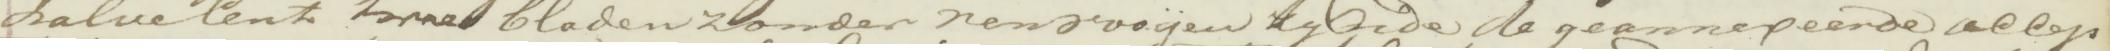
halve Cent twee bladen zonder venvooijen zynde de geannexeerde accep
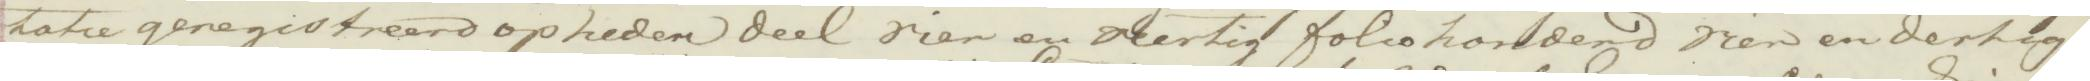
tatie geregistreerd op heden deel vier en veertig folio honderd vier en dertig
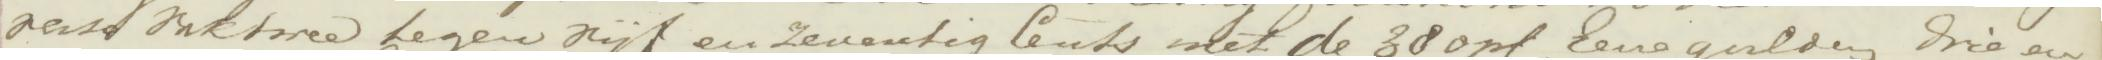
verso Vak twee tegen vijf en zeventig Cents met de 38 opC Eene gulden drie en
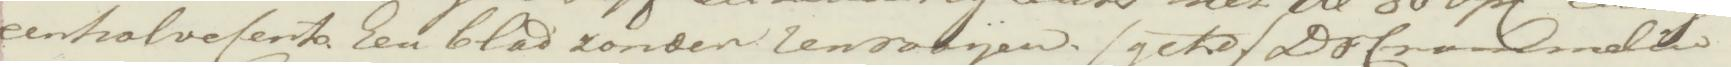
een halve Cent Een blad zonder renvooijen. /getd:/ D: F Crommelin
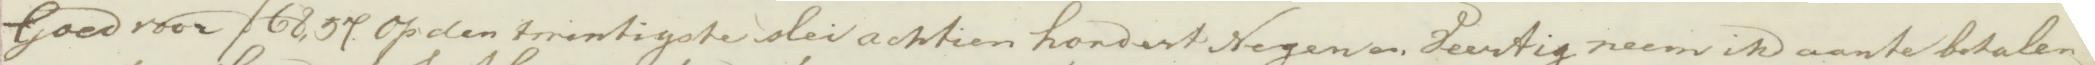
Goed voor ƒ68,57 Op den twintigste Mei achtien honderd Negen en Veertig neem ik aan te betalen
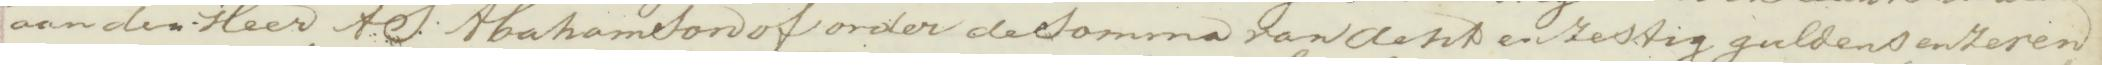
aan den Heer A. S: Abahamson of order de somma van Acht en zestig guldens en zeven
